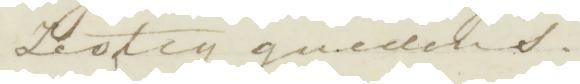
Zestig guldens.
